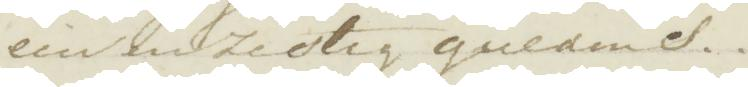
een en zestig guldens.
